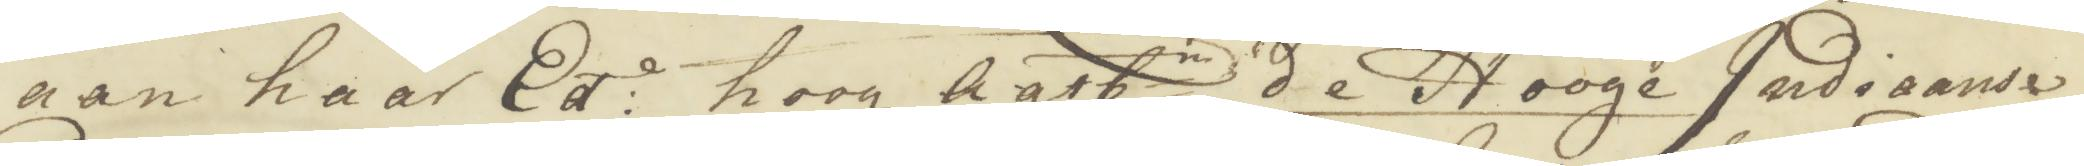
aan haar Ed:e hoog Agtb=n de Hooge Jndiaanse
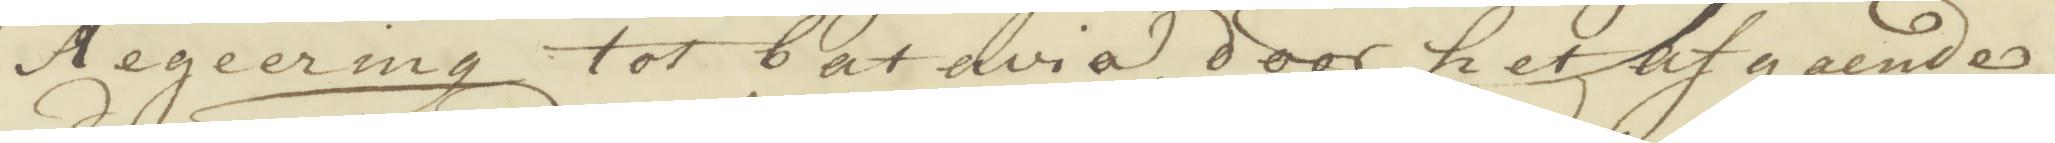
Regeering tot batavia door het afgaende
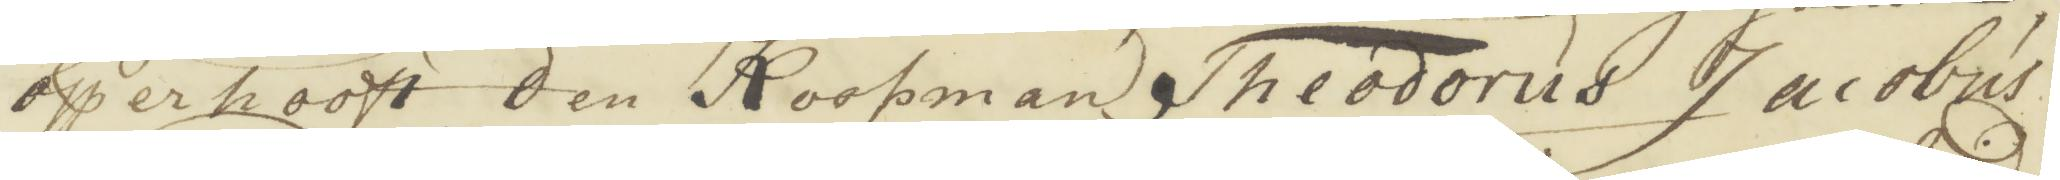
opperhooft den Koopman Theodorus Jacobus
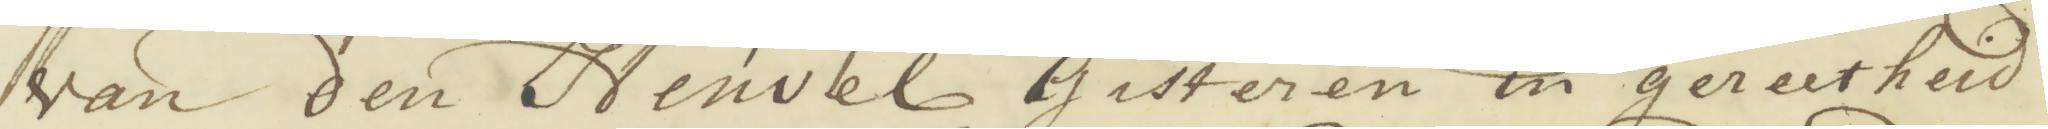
van den Heuvel Gisteren in gereetheid
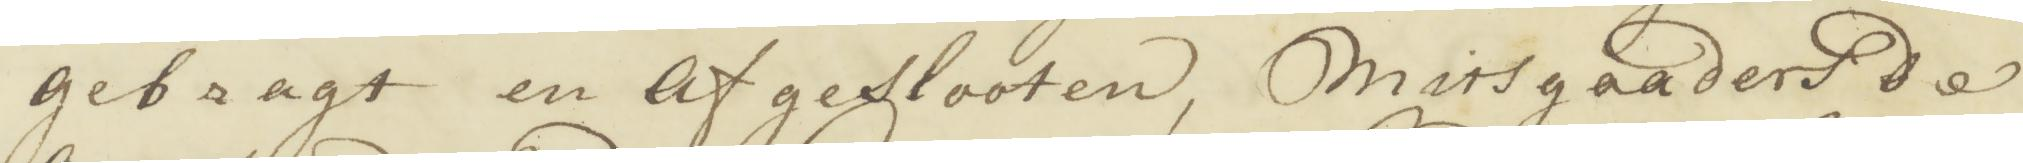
gebragt en afgeslooten mitsgaaders de
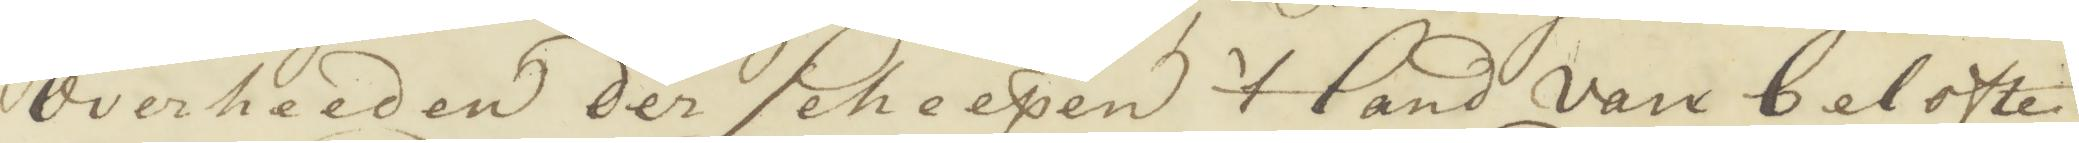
overheeden der scheepen ’t land van belofte
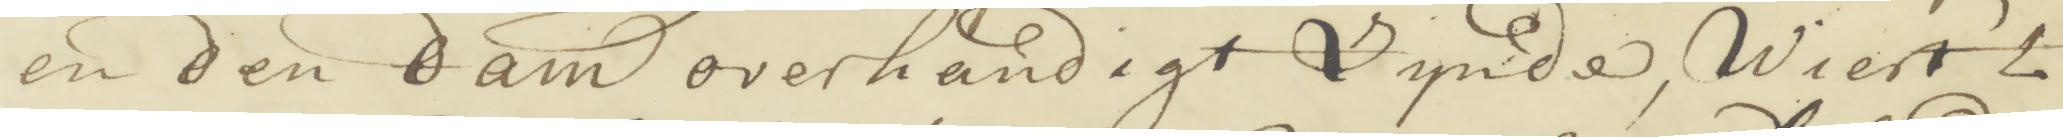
en den dam overhandigt zynde, wiert't
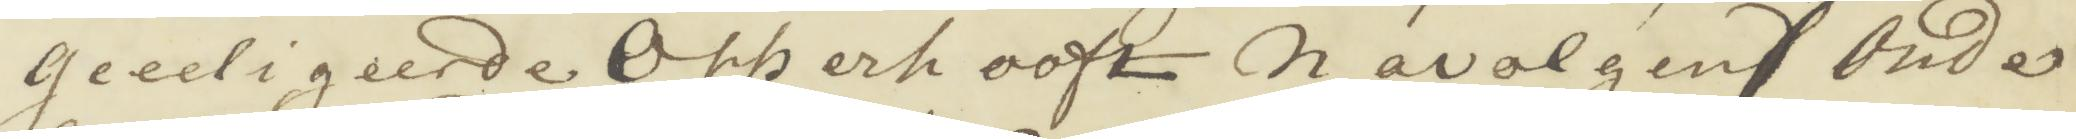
geeeligeerde opperhooft navolgens oude
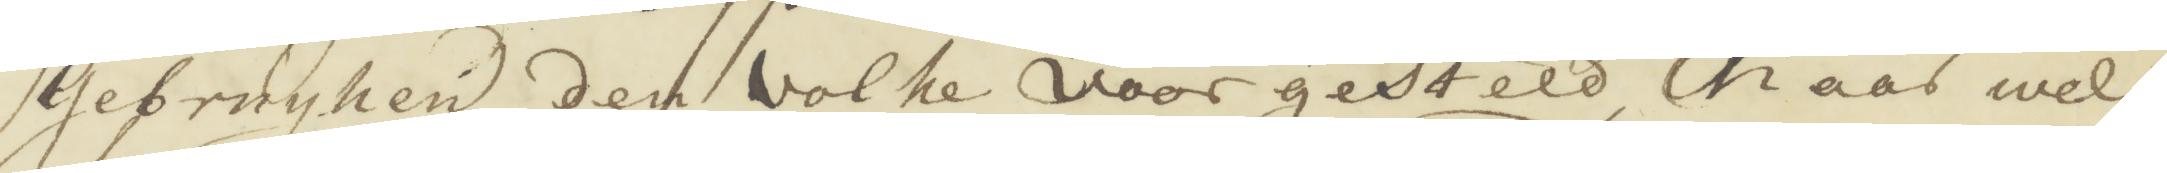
gebruyken, den volke voorgesteld, naar wel
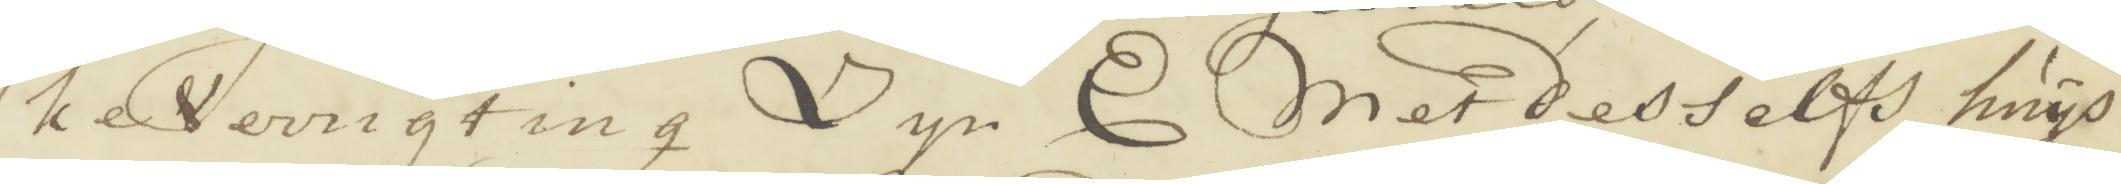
ke verrigting Zyn E Met desselfs huijs
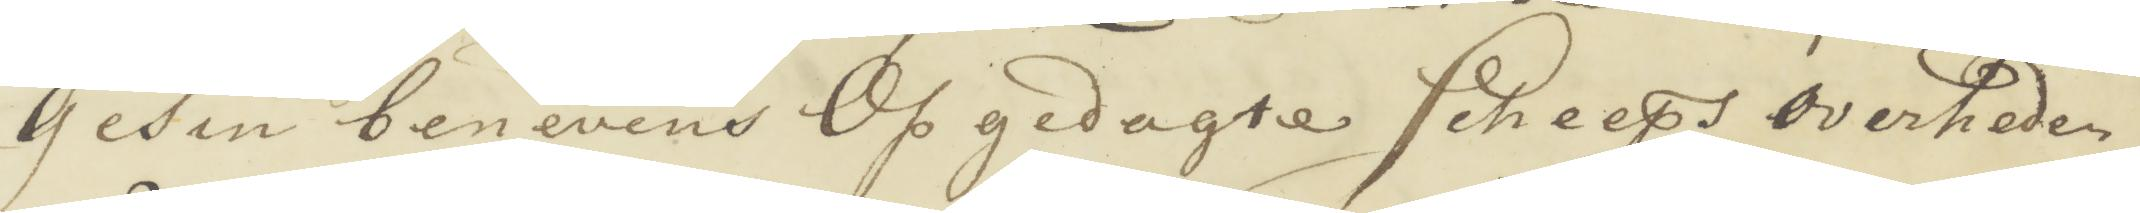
gesin benevens Op gedagte Scheeps overheden
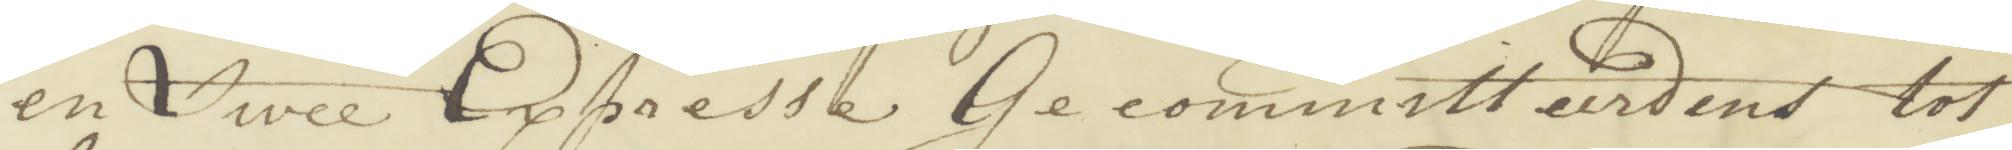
en twee Expresse Gecommitteerdens tot
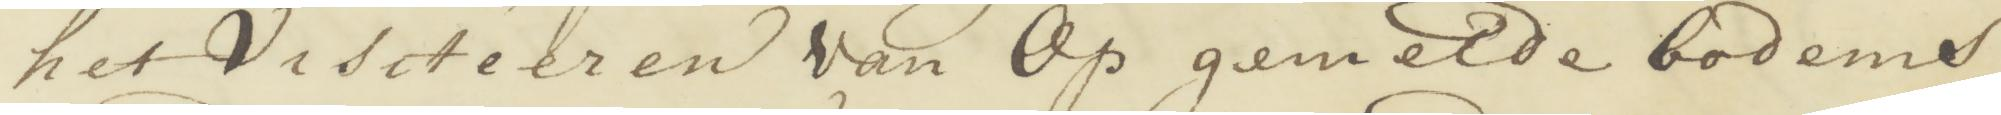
het visiteeren van Op gemelde bodems
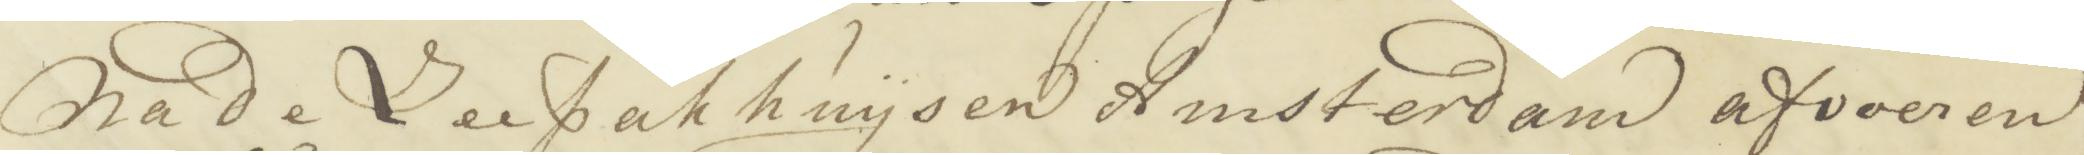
na de Zeepakhuijsen Amsterdam afvoeren
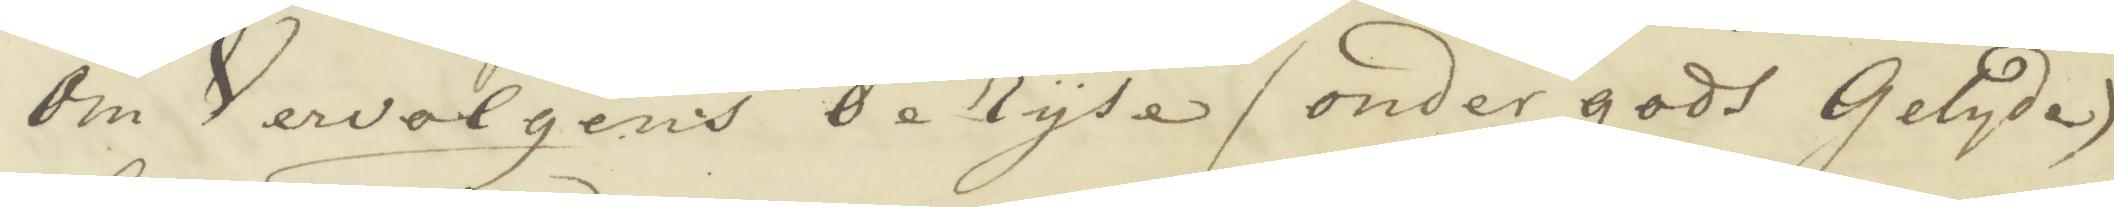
om Vervolgens de rijse (onder gods Gelyde)
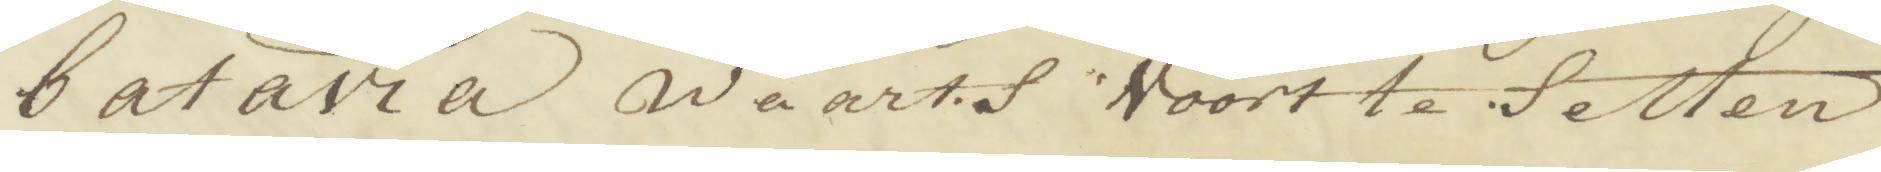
batavia waarts voort te setten
